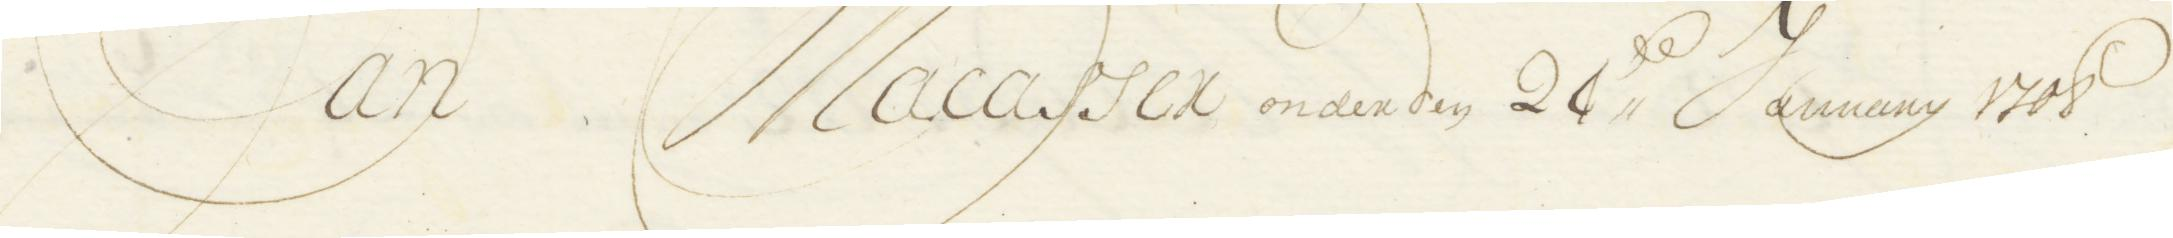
Van Macasser onder den 24de Ianuary 1708.
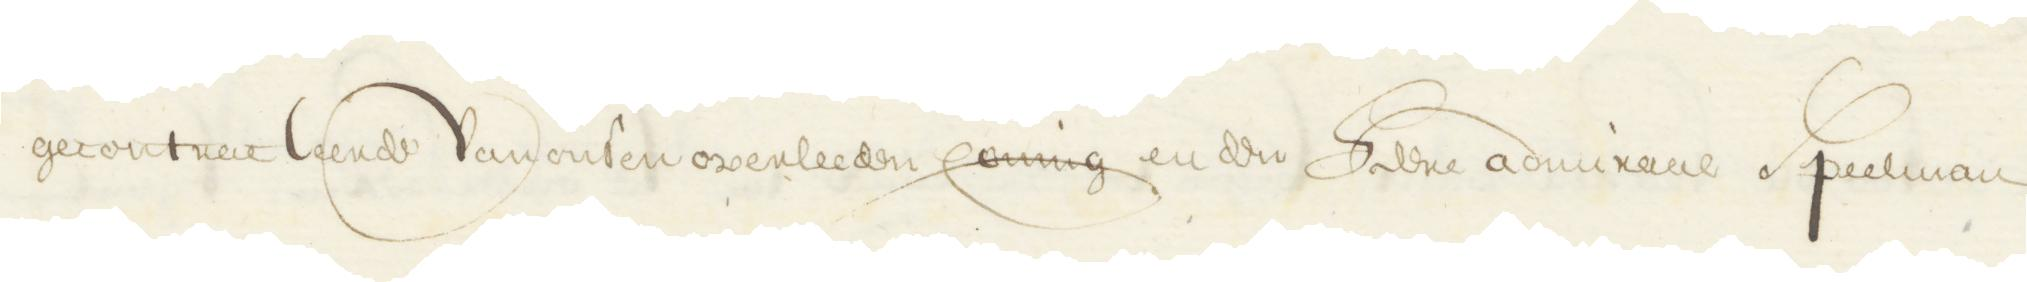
gecontracteerde van onsen overleeden Coning en den Heere admiraal Speelman
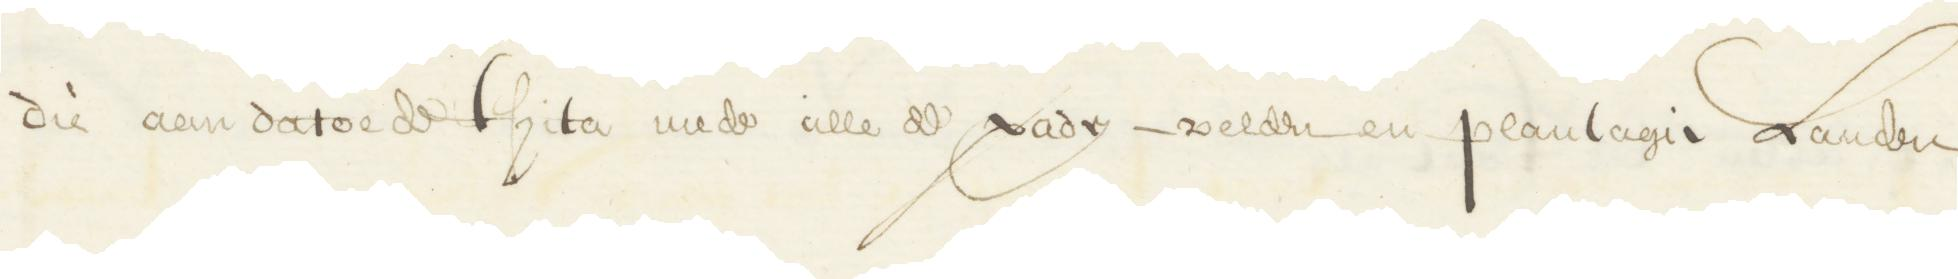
die aan datoe de thita mede alle de pady -velden en plantagie Landen
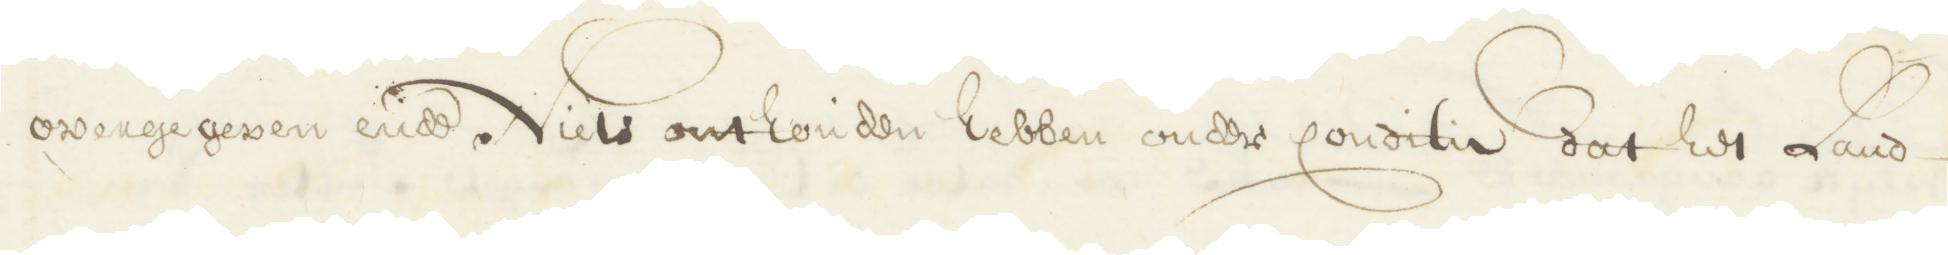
overgegeven ende Niets onthouden hebben onder conditie dat het Land
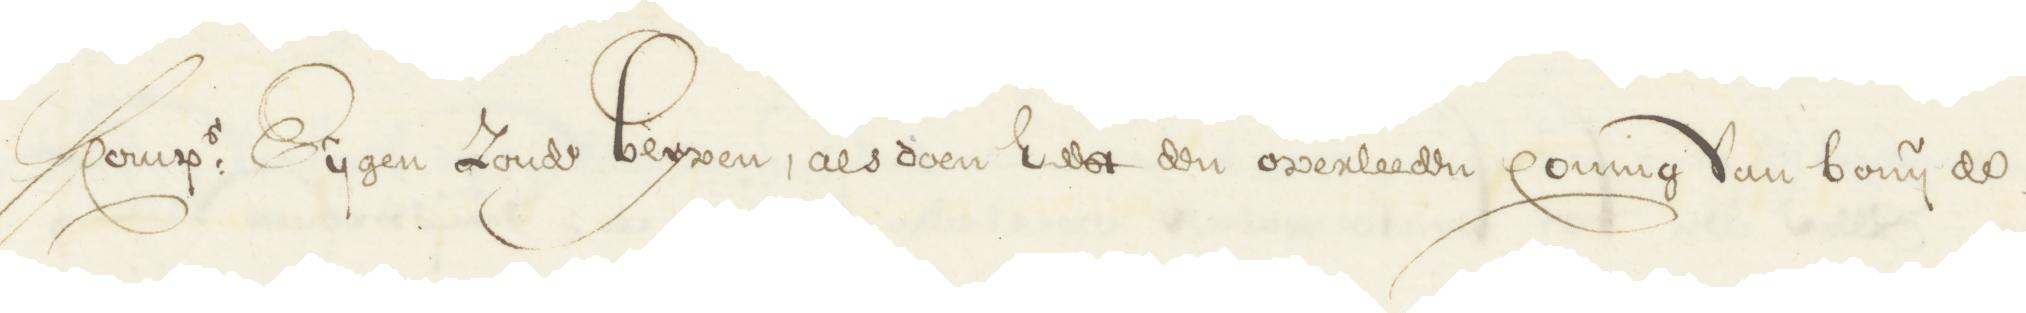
SComp:s Eijgen zoude blijven, als doen heeft den overleeden Coning van bonij de
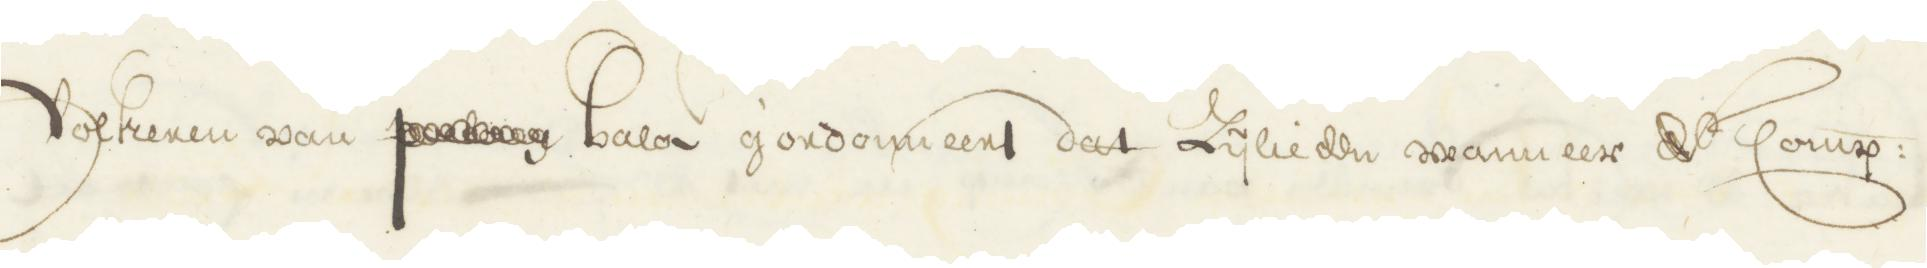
volkeren van padang baloe g'ordonneert dat zijlieden wanneer dE Comp:
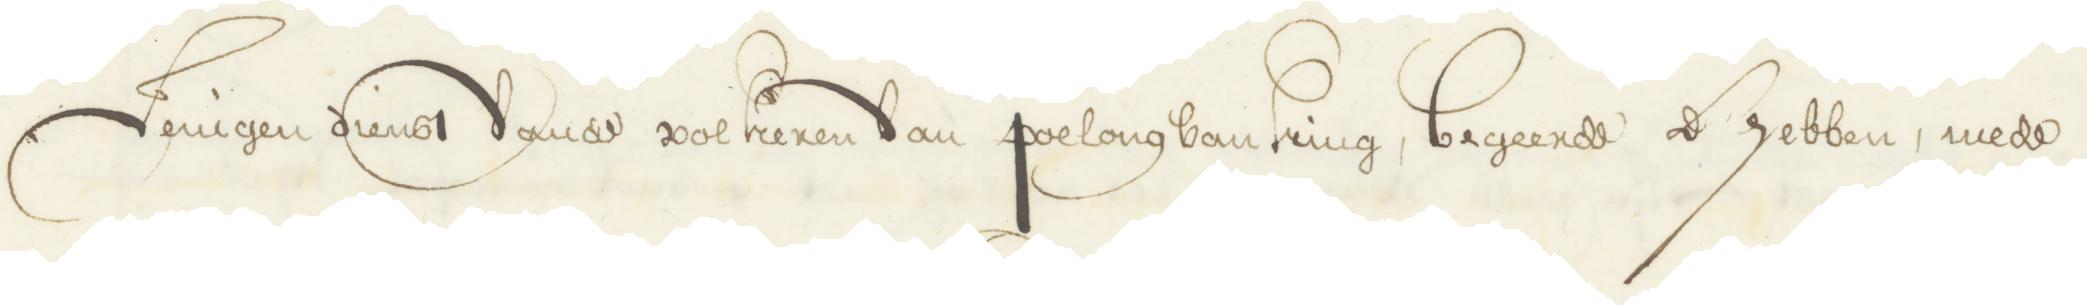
Eenigen dienst vande volkeren van poelong banking, begeerde te hebben, mede
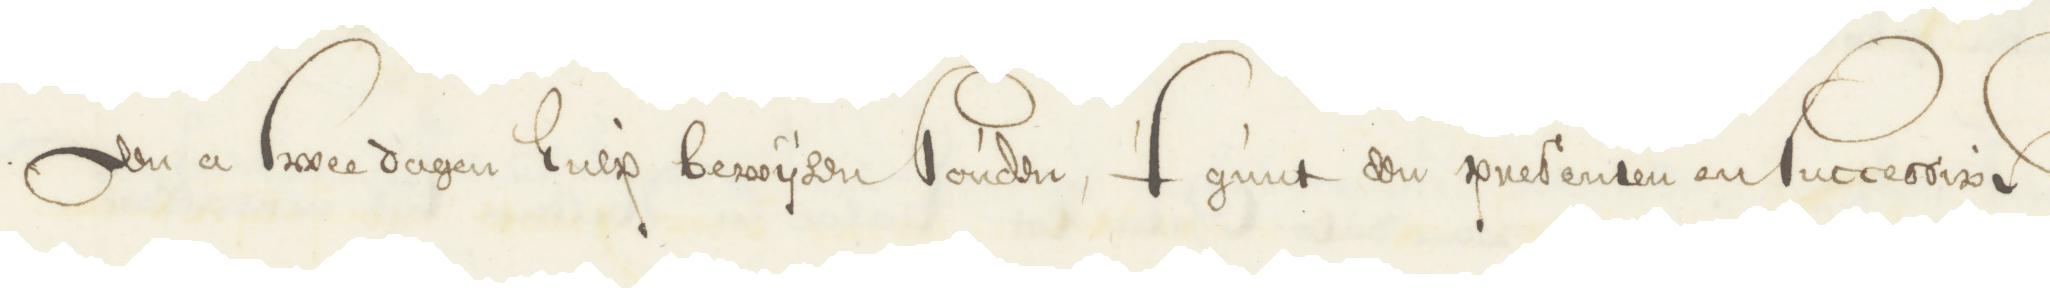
Een a twee dagen hulp bewijsen souden, ’t gunt den presenten en successive
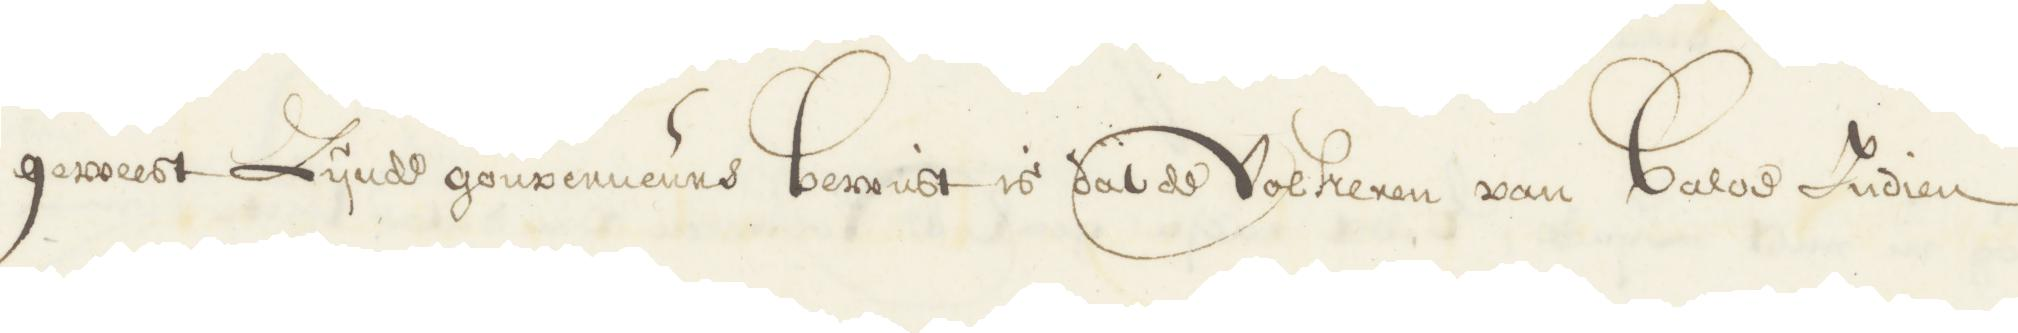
geweest zijnde gouverneurs bewust is dat de volkeren, van baloe Indien
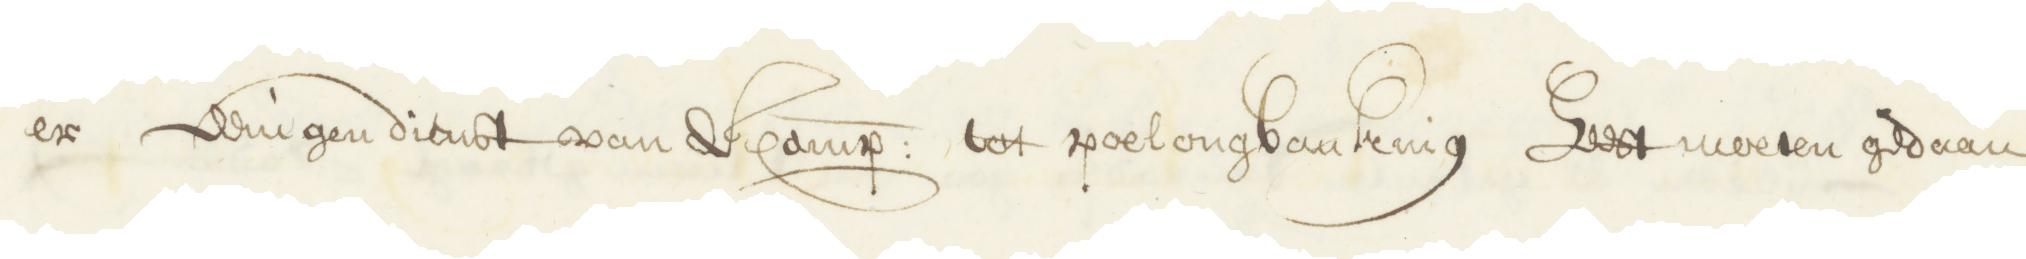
er eenigen dienst van dEComp: tot poelongbanking heeft moeten gedaan
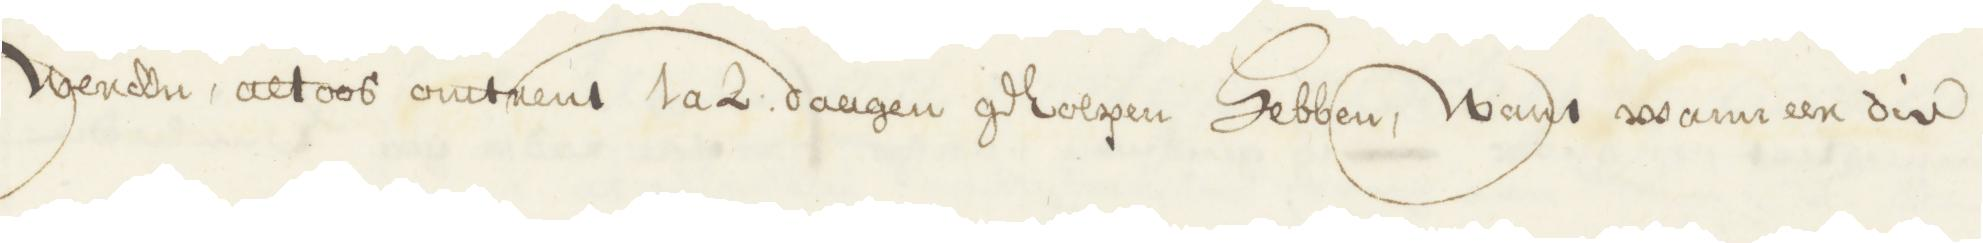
werden, altoos omtrent 1 a 2: daagen geholpen hebben, want wanneer die
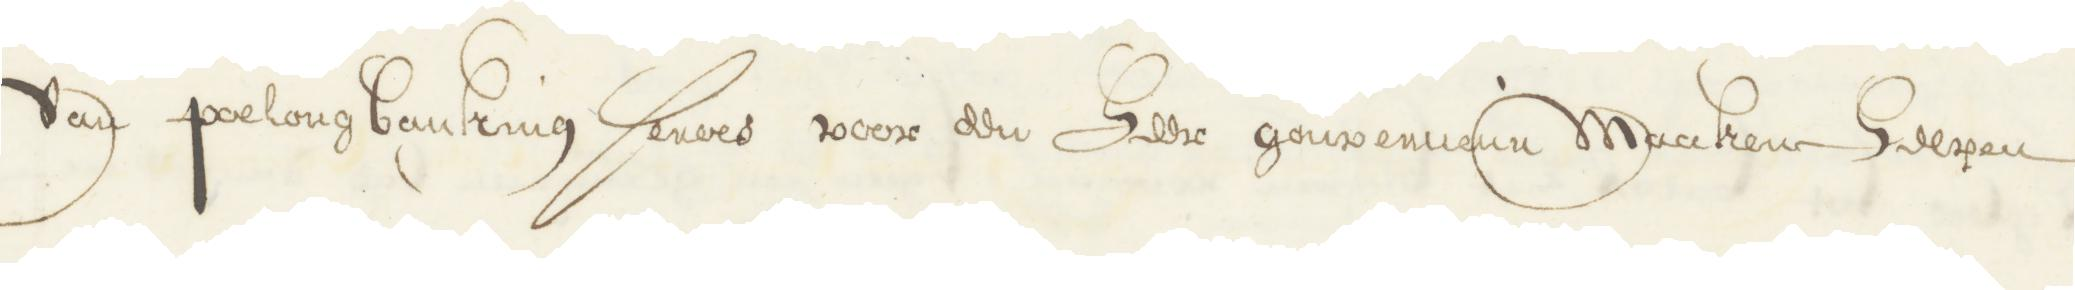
van poelongbanking serves voor den Heer gouverneur maaken helpen
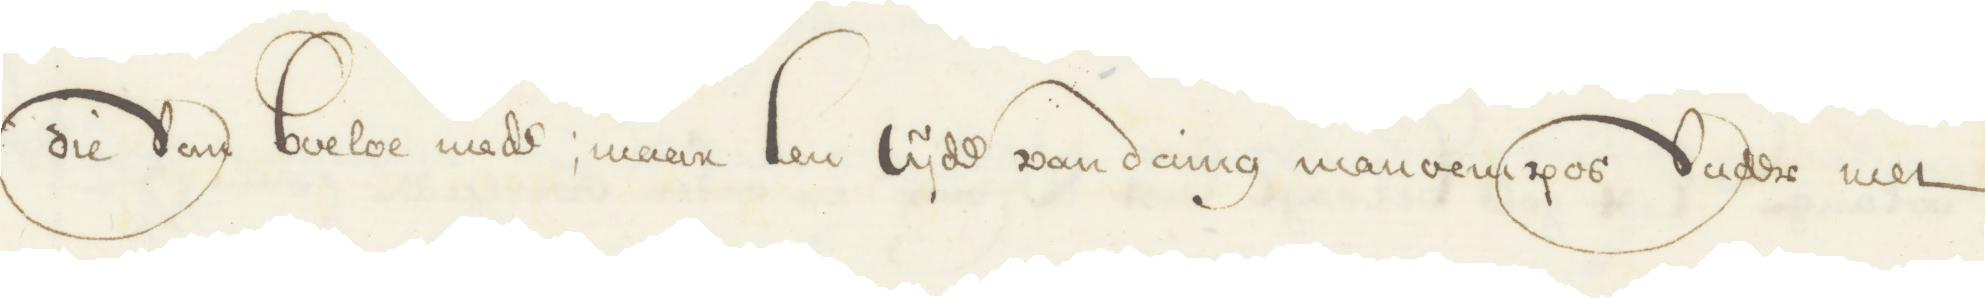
die van boeloe mede, maar ten tijde van daing manoempos vader met
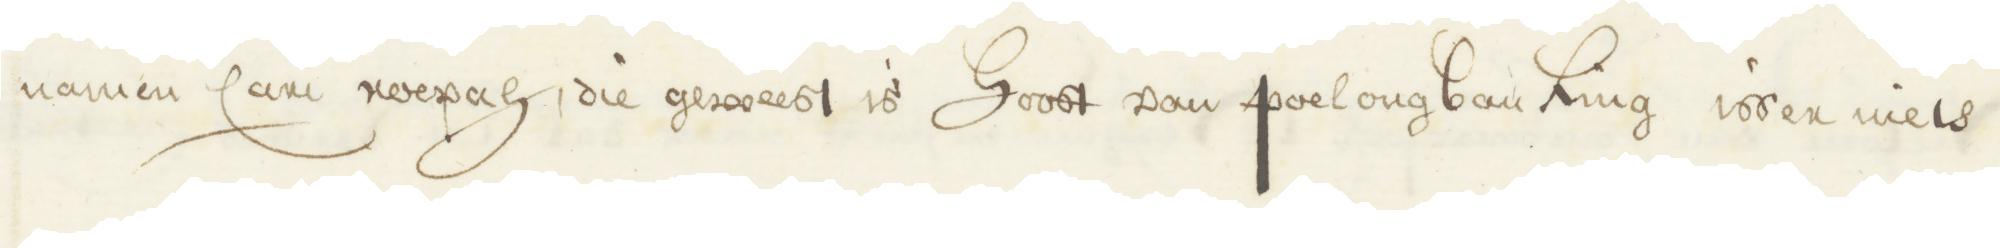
namen Cari roepal, die geweest is Hooft van poelongbanking isser niets
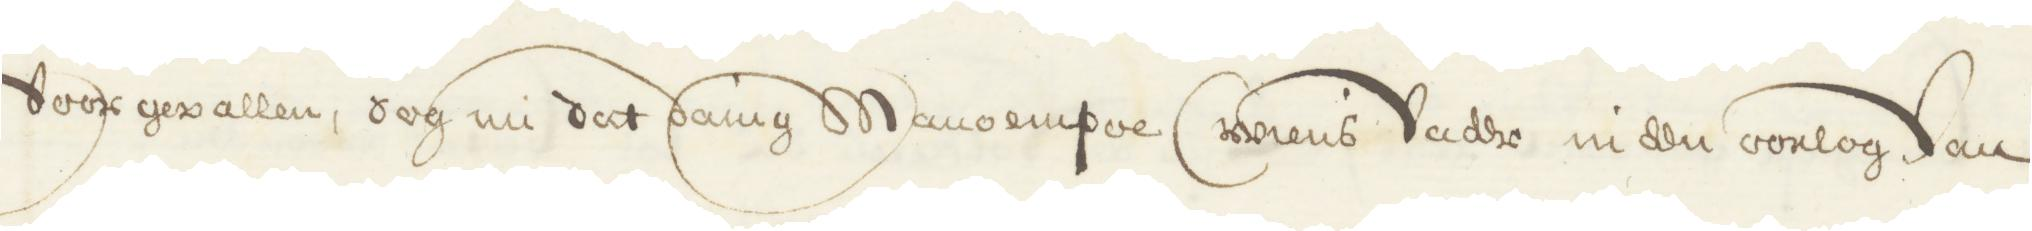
voor gevallen, dog nu dat daing Manoempoe (wiens vader in den oorlog van
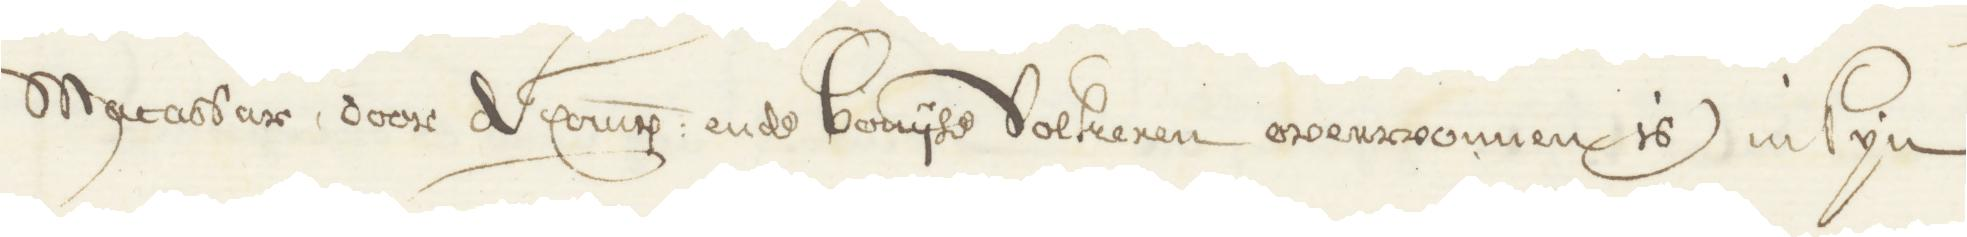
Macassar, door dE Comp: ende bonijse Volkeren overwonnen is) in sijn
